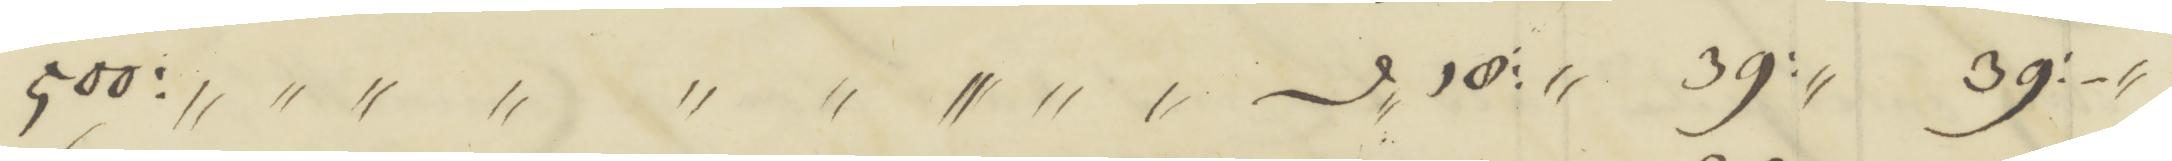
500: „ „ „ „ „ „ „ „ „ d„ 18: „ 39: „ 39: —„
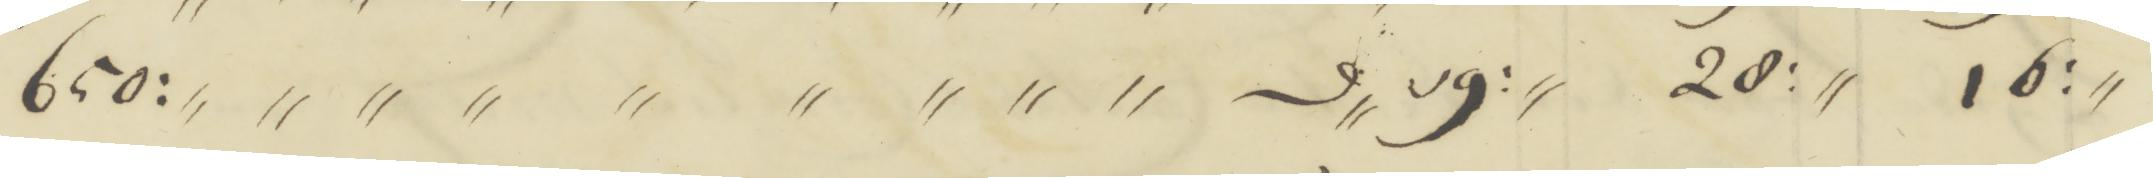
650: „ „ „ „ „ „ „ „ „ d„ 19: „ 28: „ 16: „
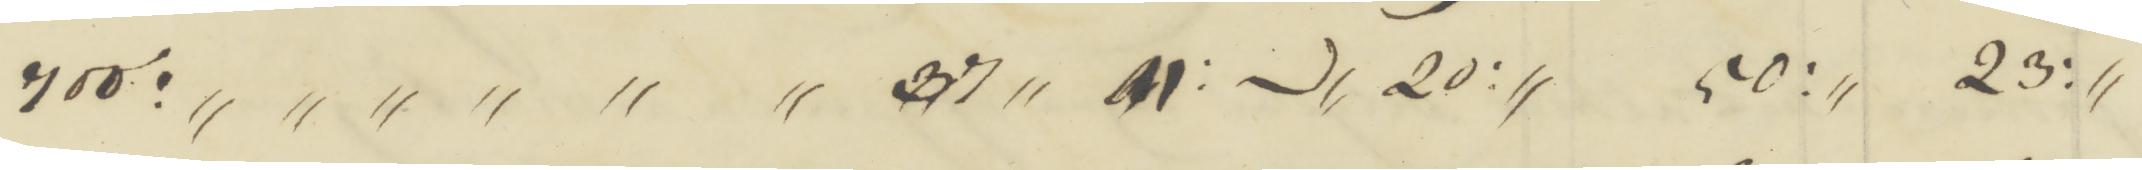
700: „ „ „ „ „ „ 37 „ 41: d„ 20: „ 50: „ 23: „
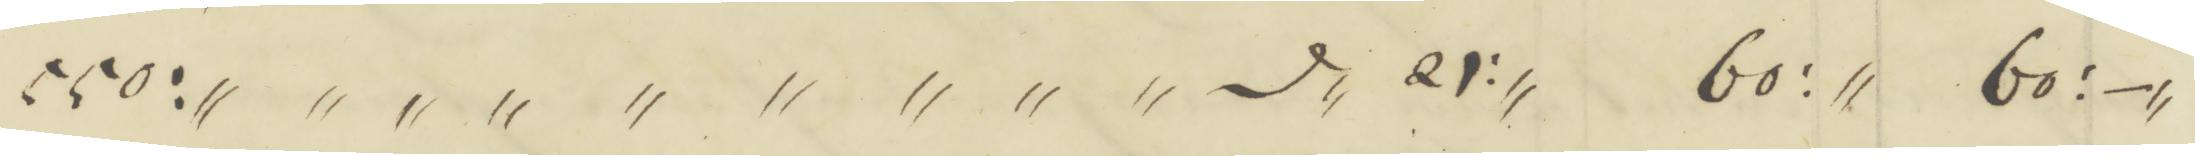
550: „ „ „ „ „ „ „ „ „ d„ 21: „ 60: „ 60: —„
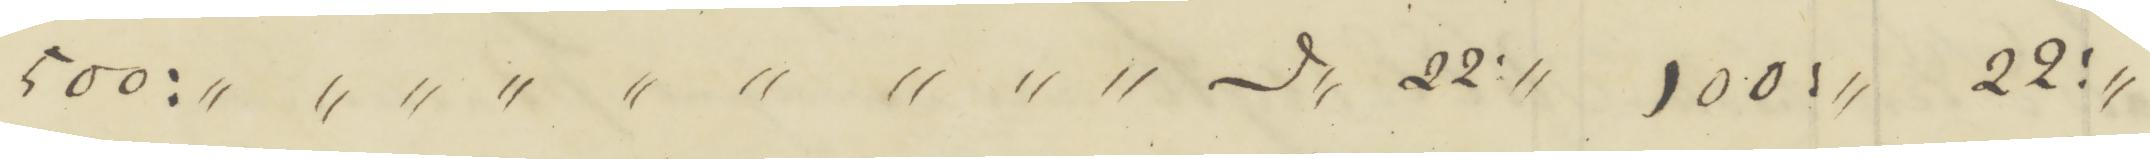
500: „ „ „ „ „ „ „ „ „ d„ 22: „ 100: „ 22: „
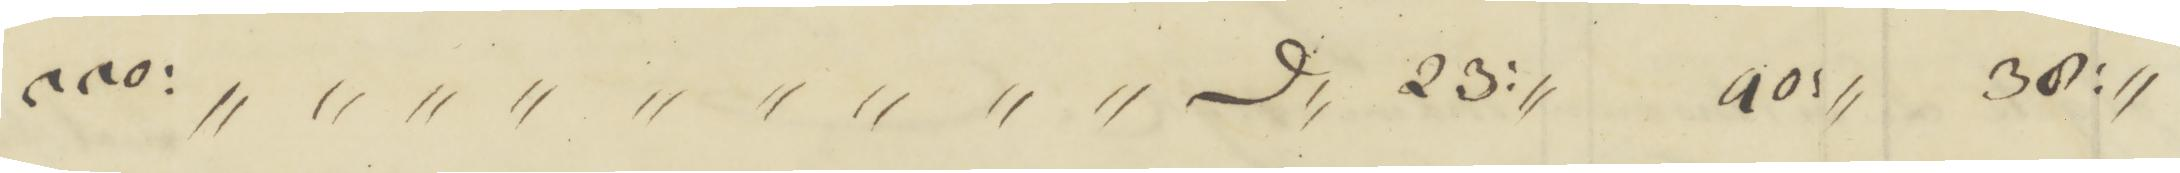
550: „ „ „ „ „ „ „ „ „ d„ 23: „ 40: „ 38: „
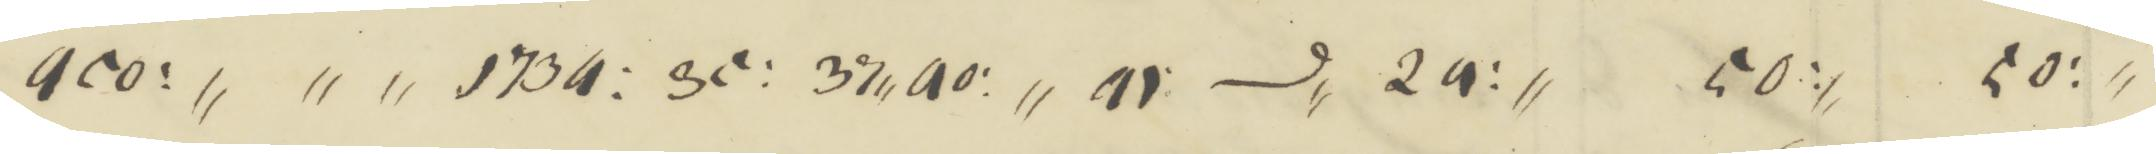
450: „ „ „ 1734: 35: 37„ 40: „ 41: d„ 24: „ 50: „ 50: „
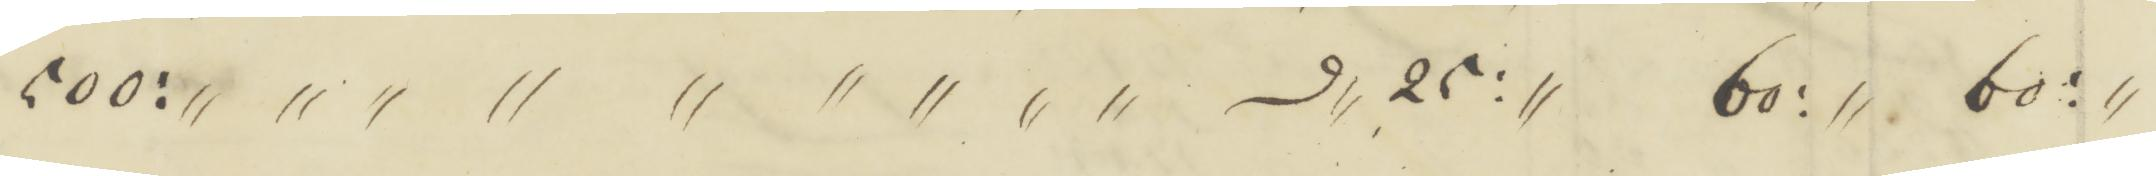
500: „ „ „ „ „ „ „ „ „ d„ 25: „ 60: „ 60: „
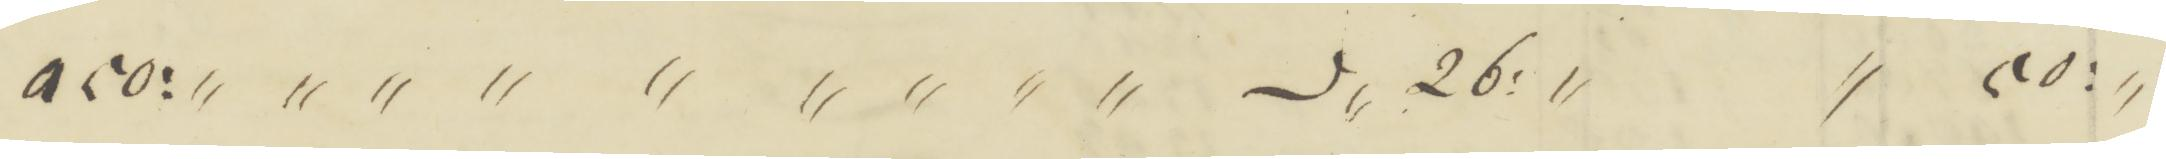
450: „ „ „ „ „ „ „ „ „ d„ 26: „ „ 50: „
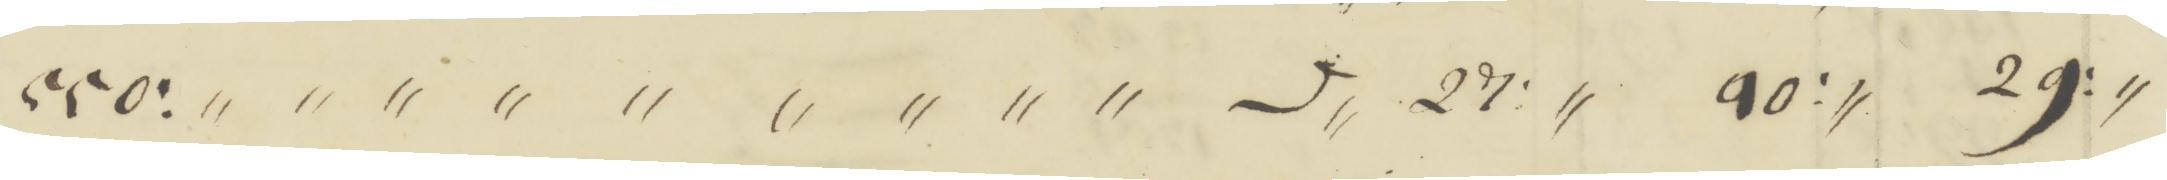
550: „ „ „ „ „ „ „ „ „ d„ 27: „ 40: „ 29: „
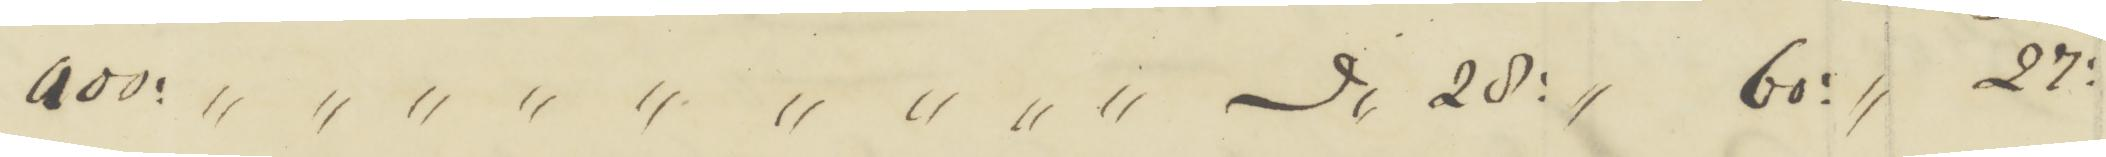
400: „ „ „ „ „ „ „ „ „ d„ 28: „ 60: „ 27: „
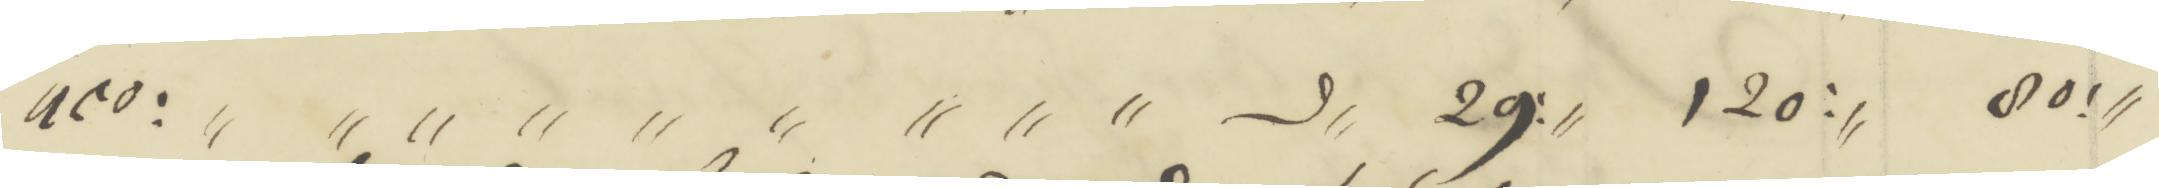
450: „ „ „ „ „ „ „ „ „ d„ 29: „ 120: „ 80: „
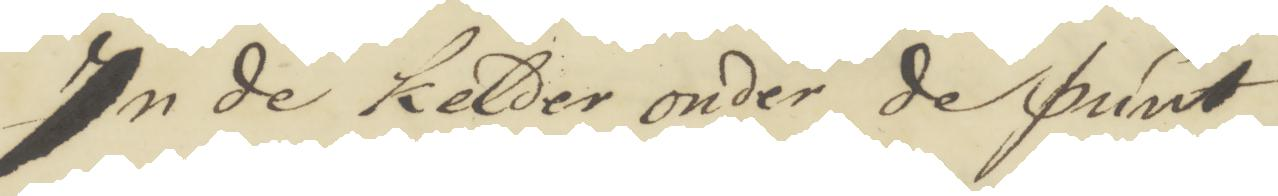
Jn de kelder onder de punt
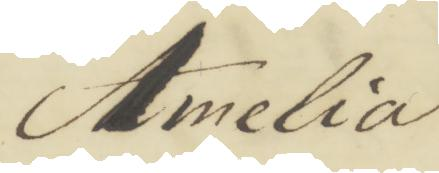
Amelia
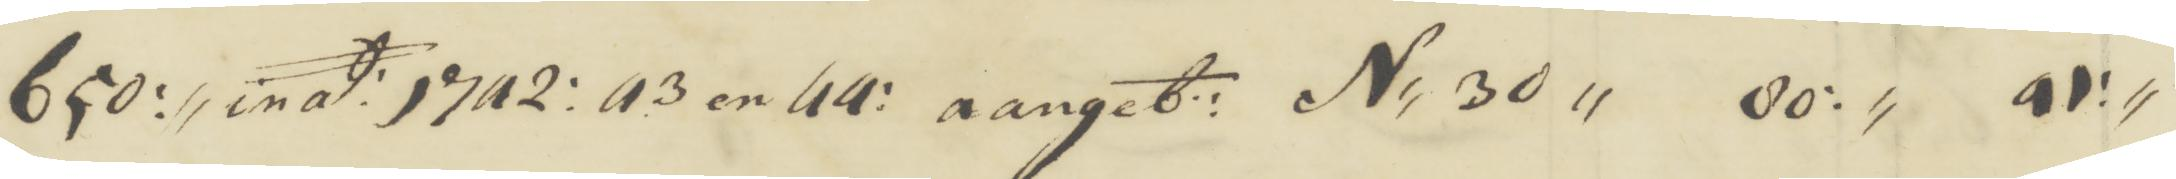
650: „ in a:o 1742: 43 en 44: aangeb: N„ 30 „ 80: „ 41: „
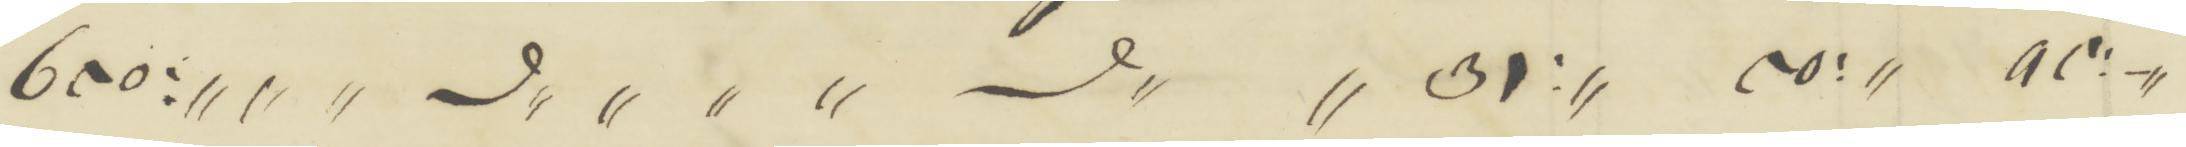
650: „ „ „ d„ „ „ „ d„ „ 31: „ 50: „ 45: —„
